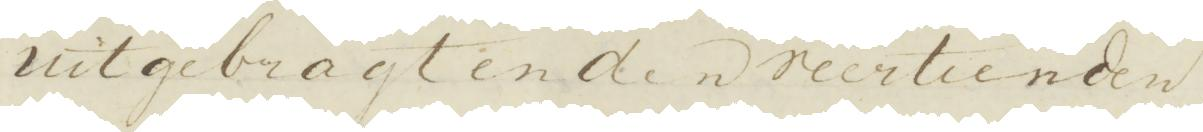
uitgebragt en den veertienden
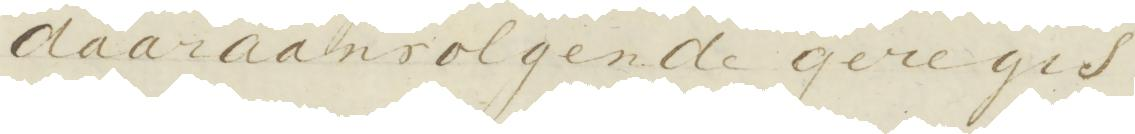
daaraanvolgende geregis
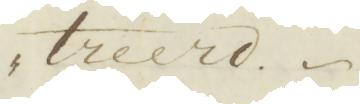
„treerd. —
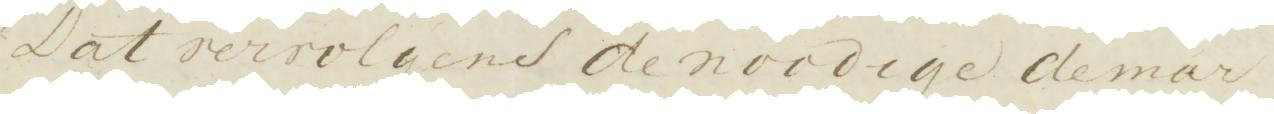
Dat vervolgens de noodige demar
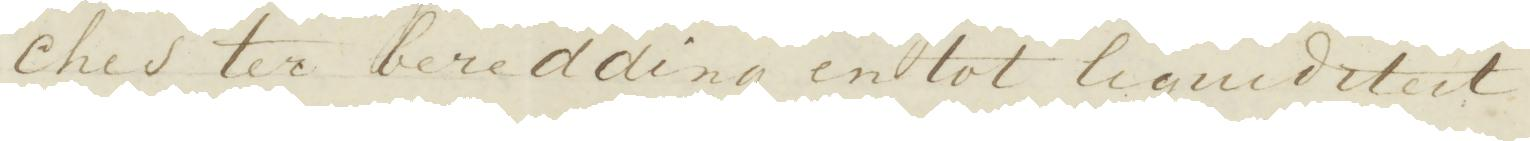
ches ter beredding en tot liquiditeit
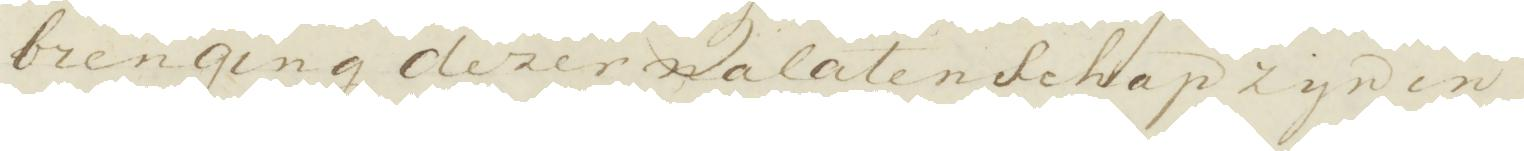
brenging dezer nalatenschap zijn in
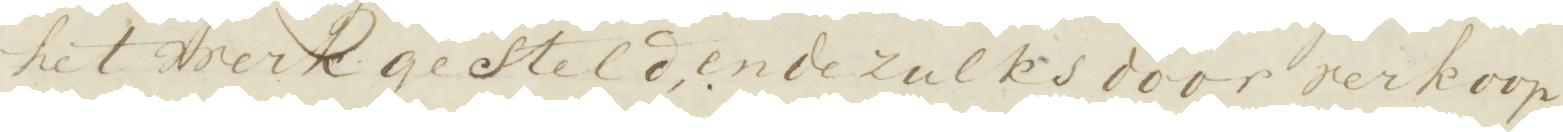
het werk gesteld, ende zulks door verkoop
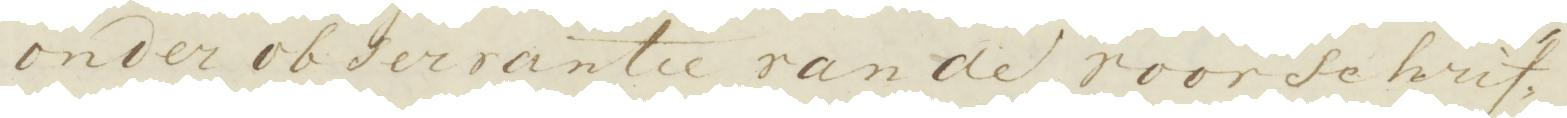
onder observantie van de voorschrif„
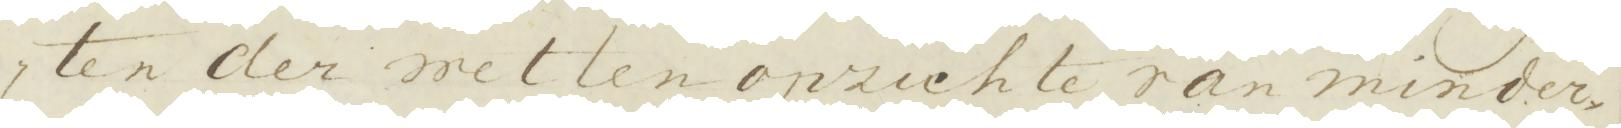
„ten der wet ten opzichte van minder„
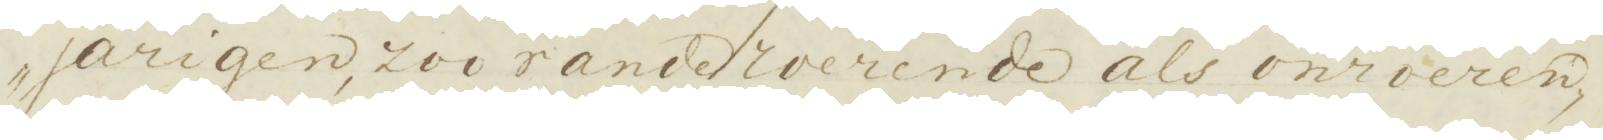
„jarigen, zoo vande roerende als onroeren
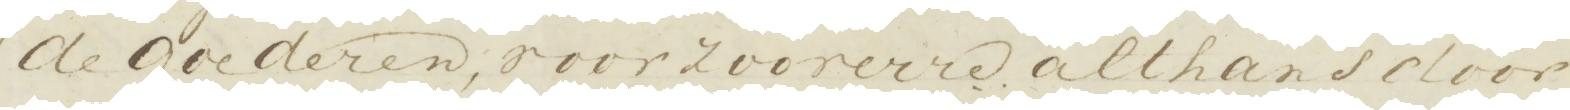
de goederen, voor zooverre, althans door
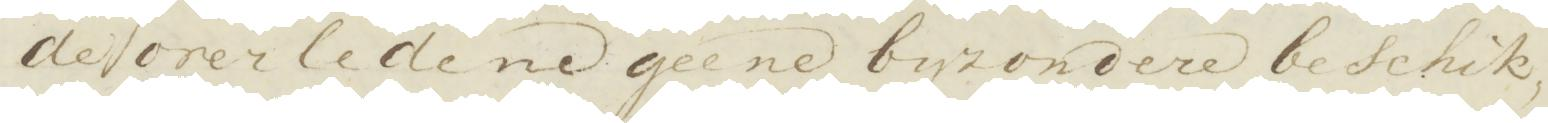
de overledene geene byzondere beschik„
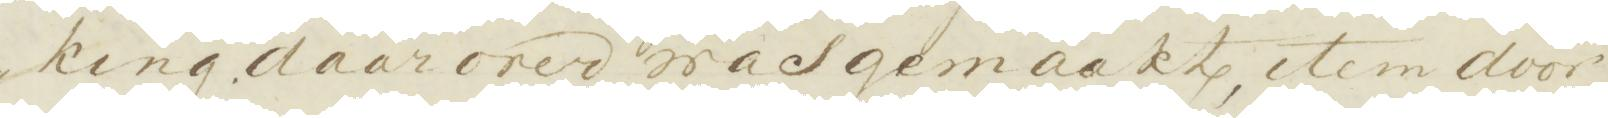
king, daar over was gemaakt, item door
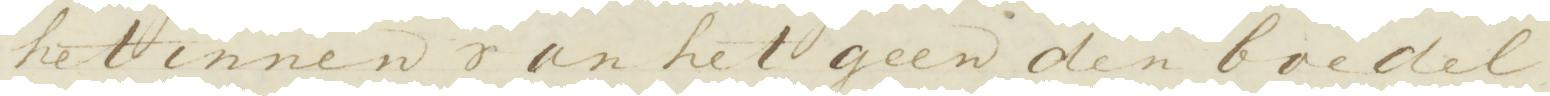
het innen van het geen den boedel
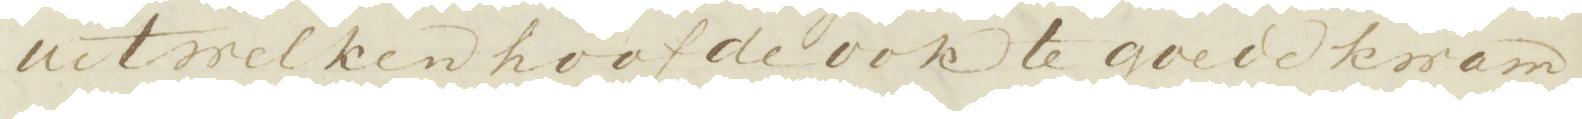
uitwelken hoofde ook te goede kwam
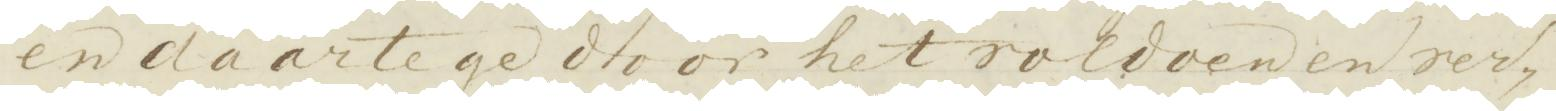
en daartege door het voldoen en ver„
